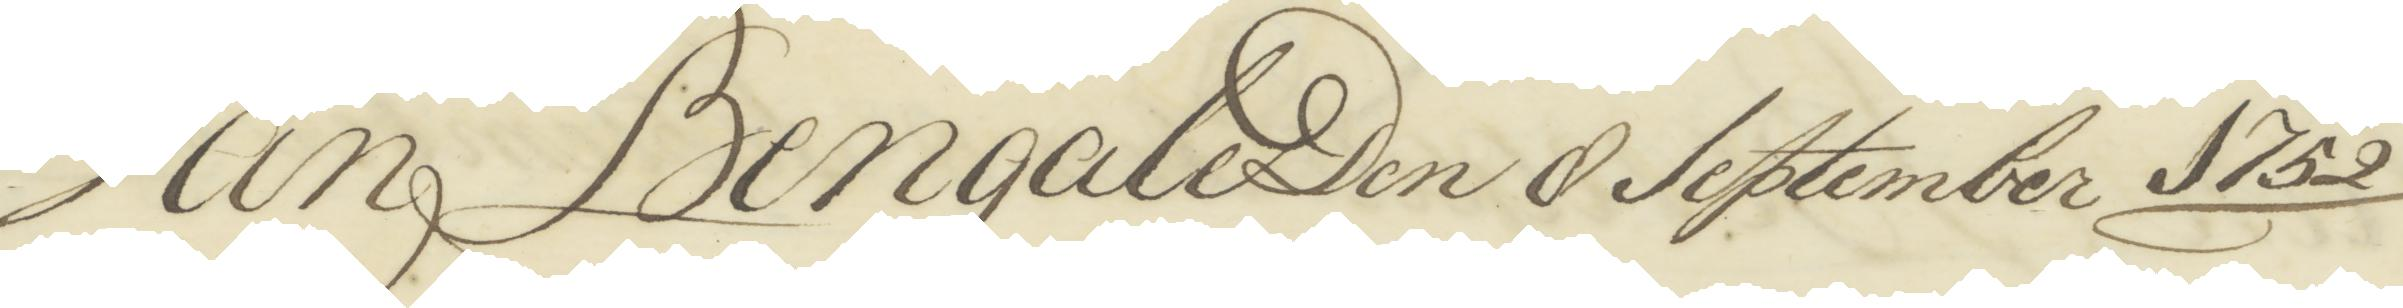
Van Bengale Den 8 September 1752
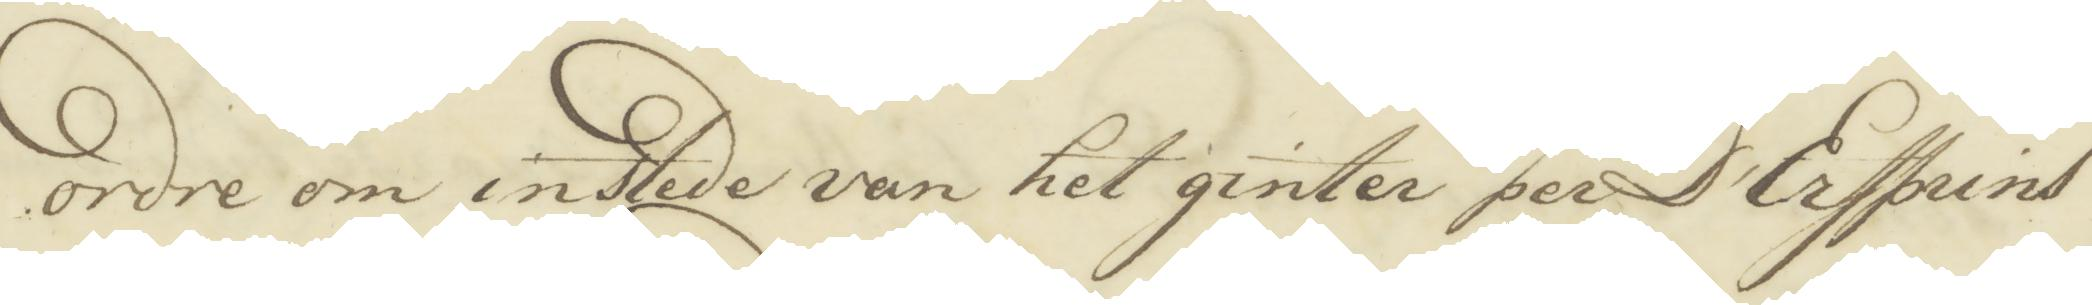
ordre om instede van het ginter per D' Erfprins
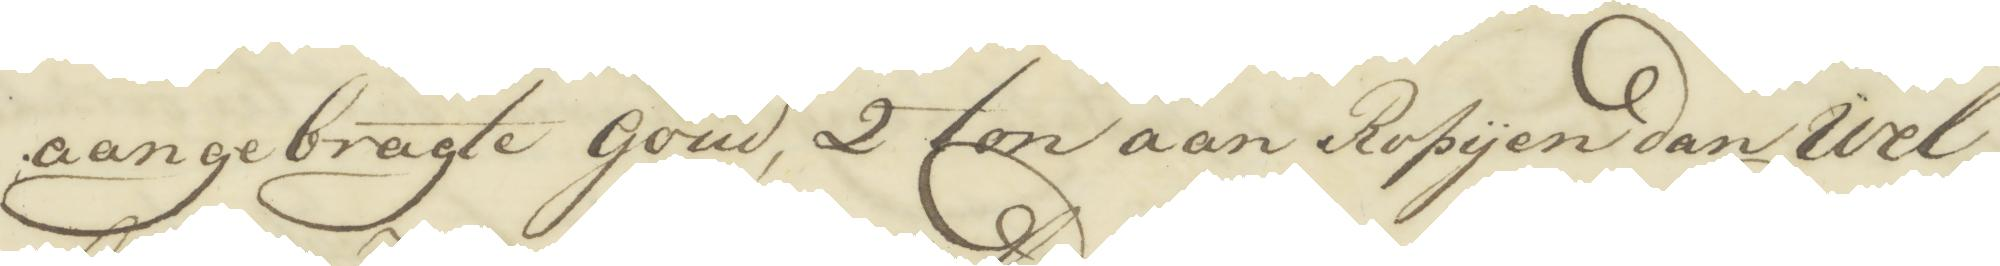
aangebragte goud, 2 ton aan Ropijen dan wel
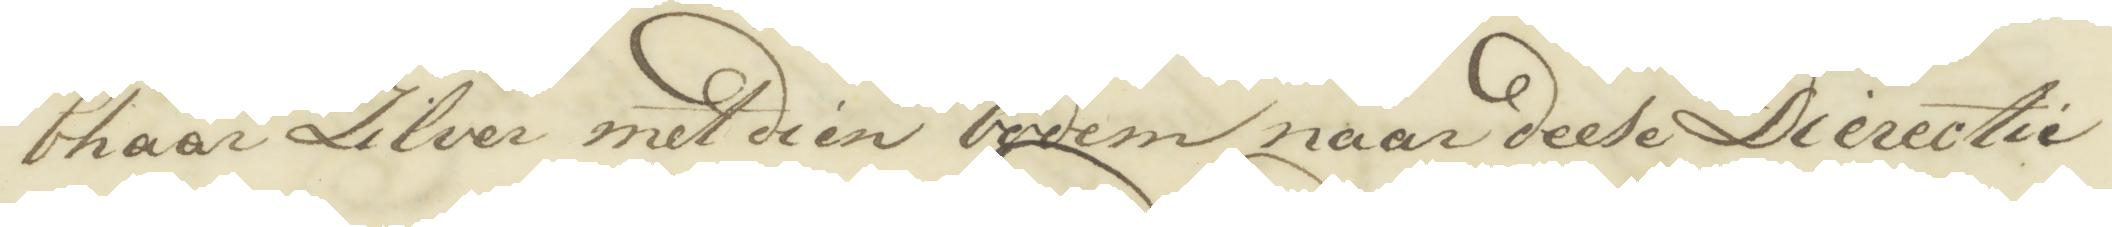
bhaar Zilver met dien bodem naar deese Dierectie
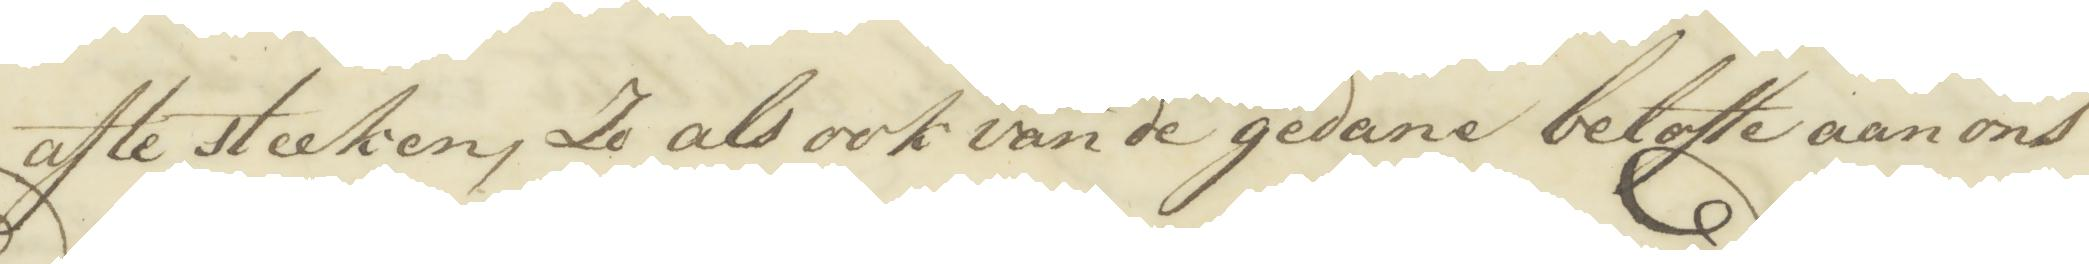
afte steeken, Zo als ook van de gedane belofte aan ons
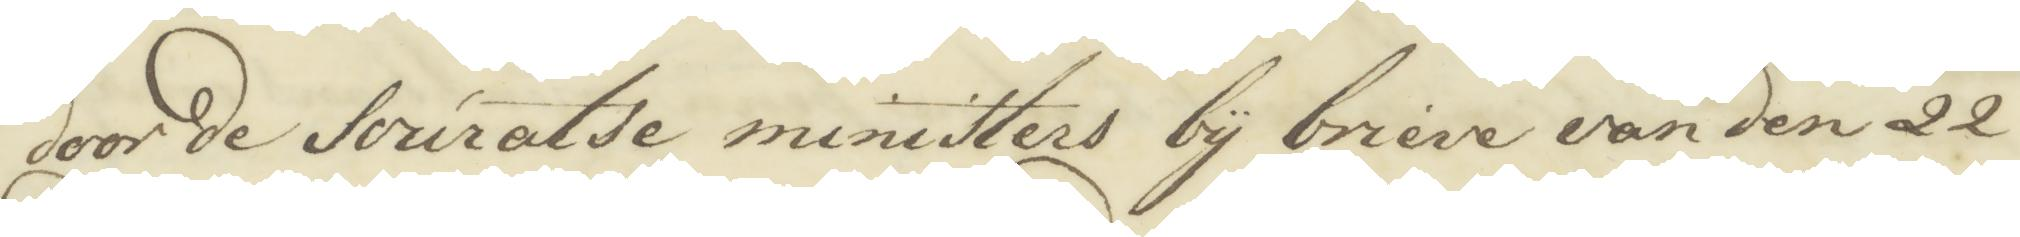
door de Souratse ministers bij brieve van den 22
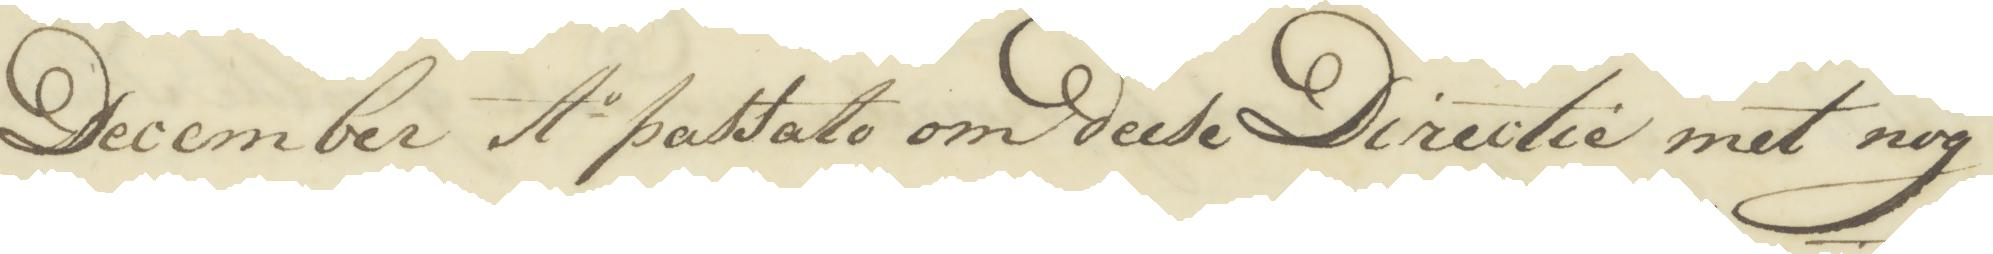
December A=o passato om deese Directie met nog
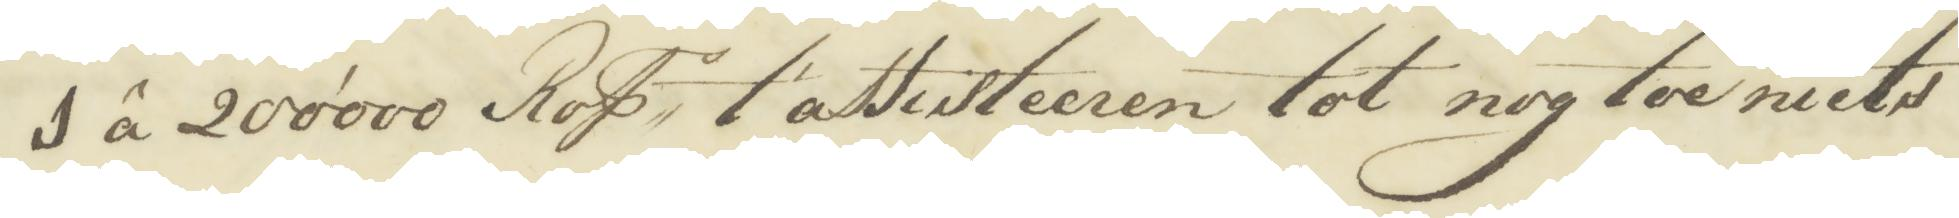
1 â 200'000 Rop„s t'assisteeren tot nog toe niets
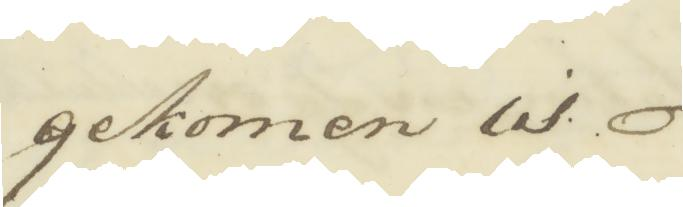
gekomen is -
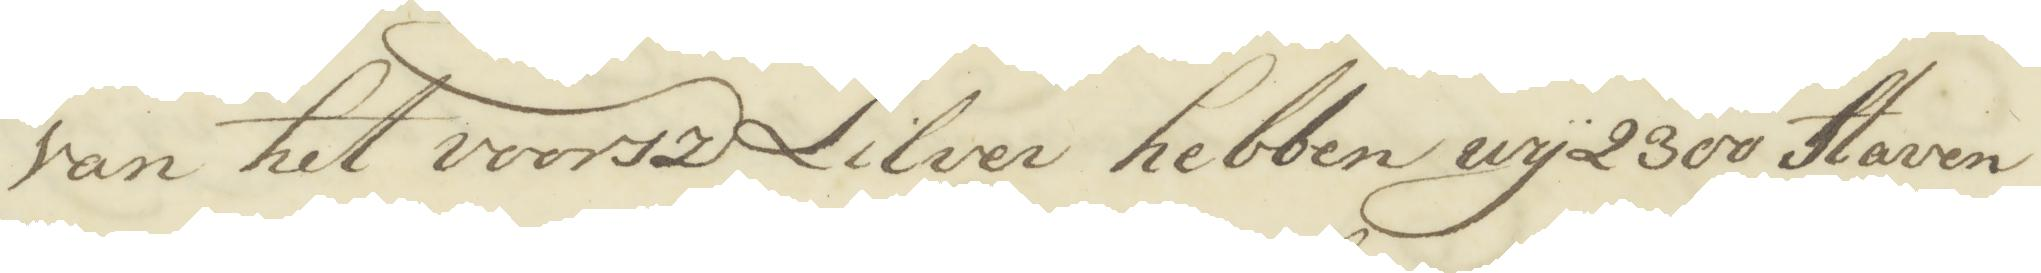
Van het voorsz Zilver hebben wij 2300 Staven
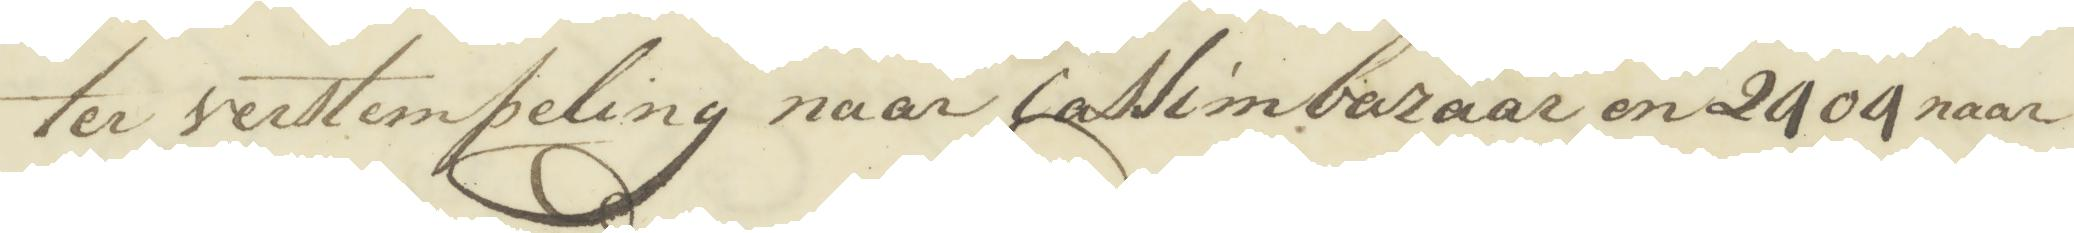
ter verstempeling naar Cassimbazaar en 2404 naar
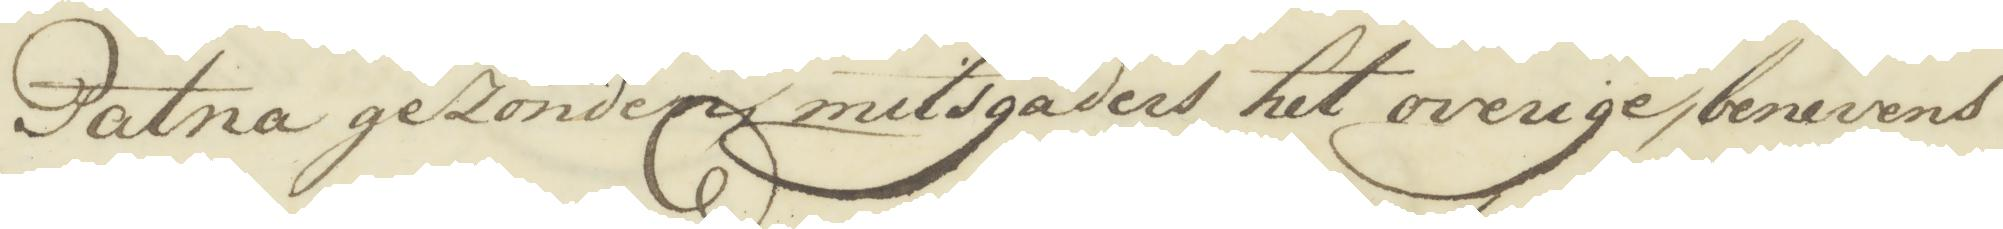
Patna gezonden, mitsgaders het overige, benevens
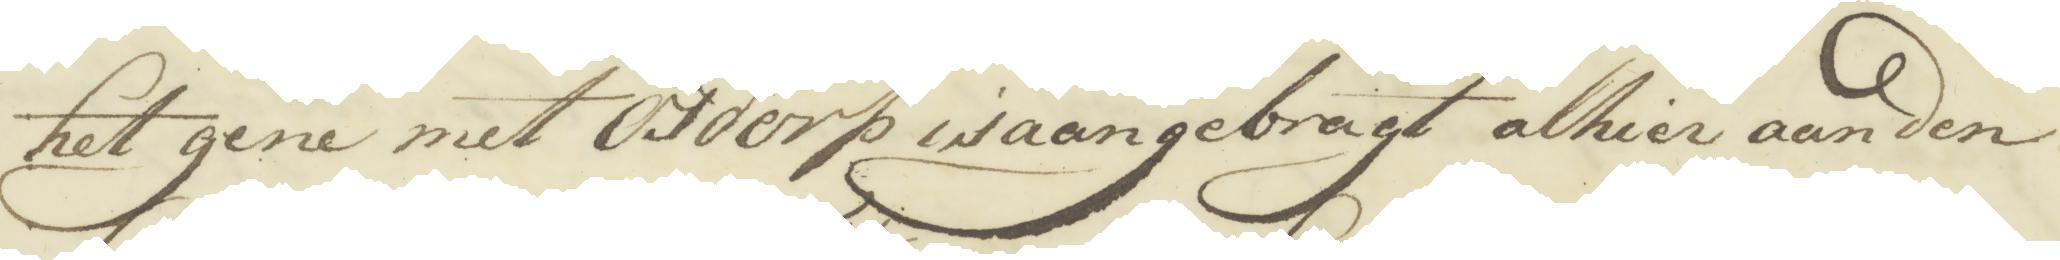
het gene met osdorp is aangebragt alhier aan den
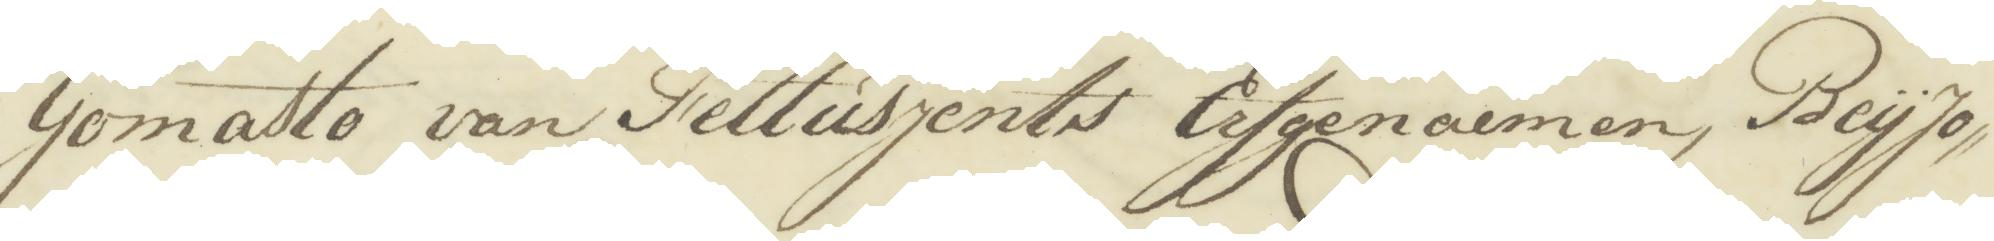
Gomasto van Fettusjents Erfgenaemen, Beij Jo„
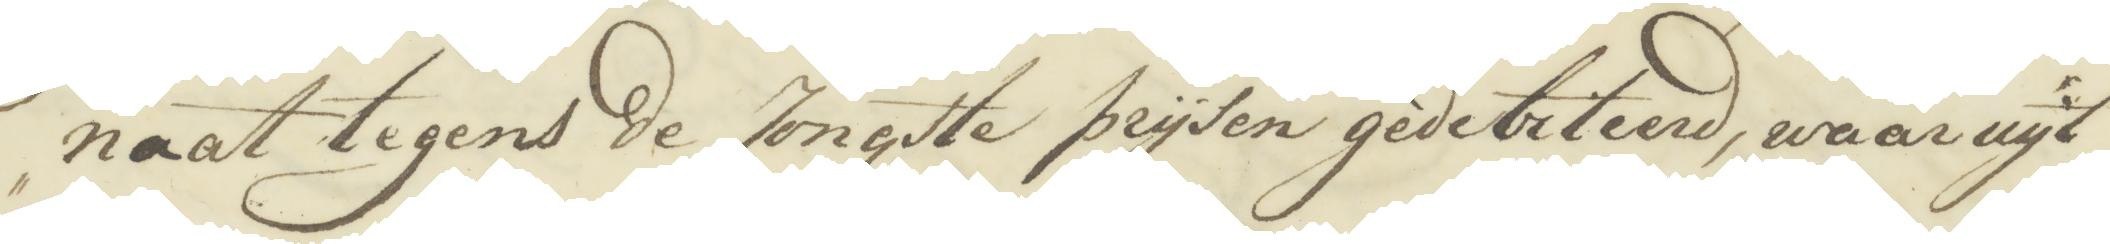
„naat tegens de Jongste prijsen gedebiteerd, waar uijt
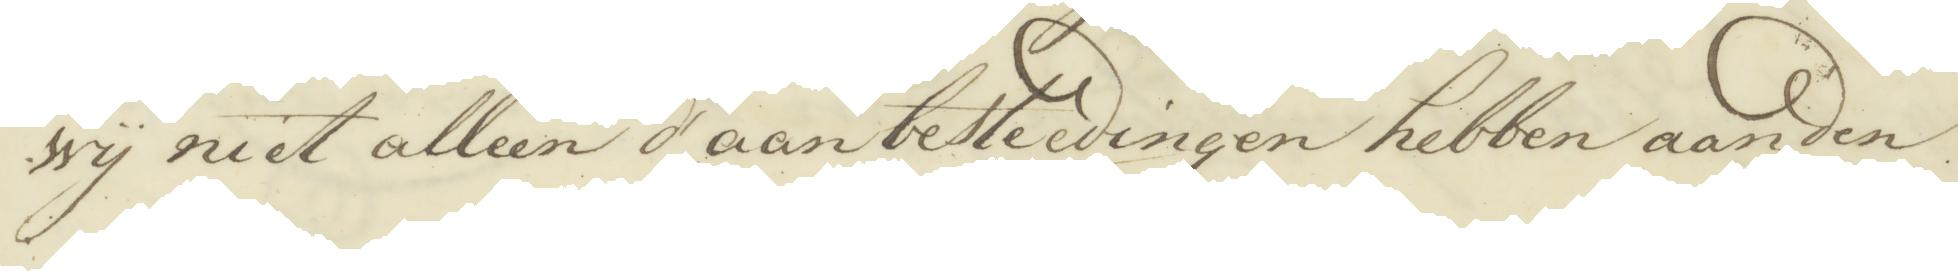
wij niet alleen d’ aan besteedingen hebben aan den
